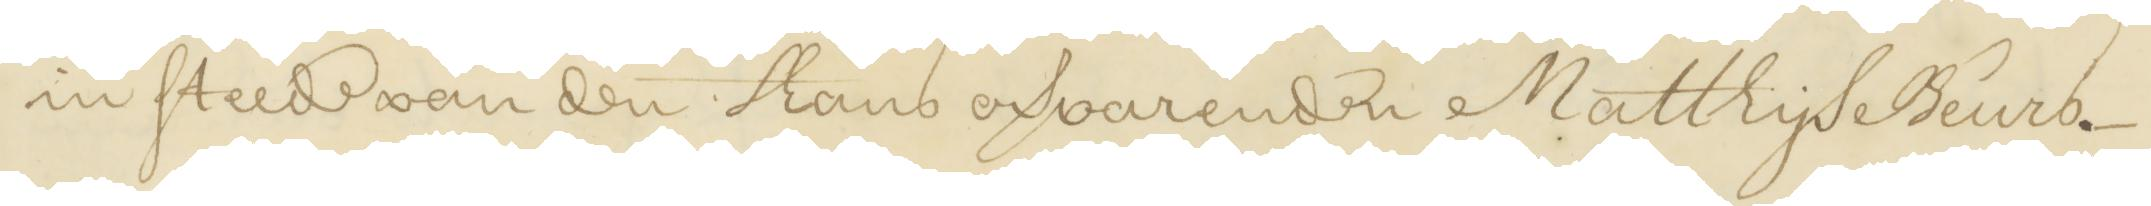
in steede van den thans overvarenden Matthijs Beurs._
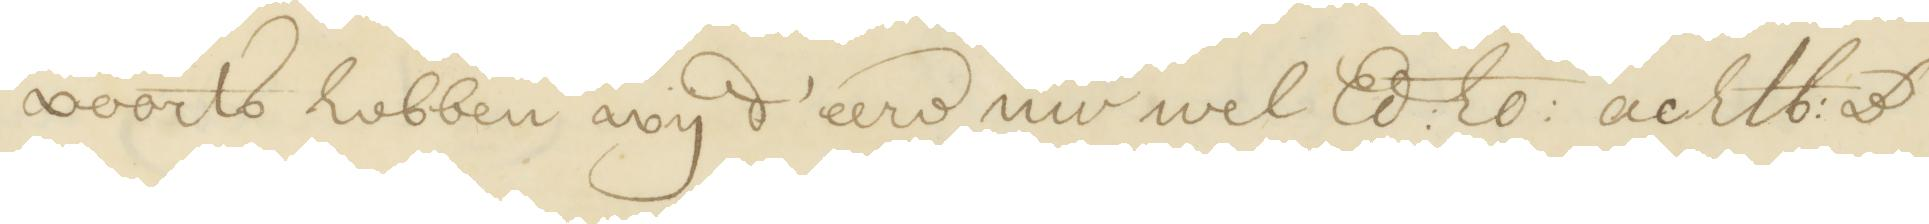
voorts hebben wij d’ eere uw wel Ed: ho: achtb: te
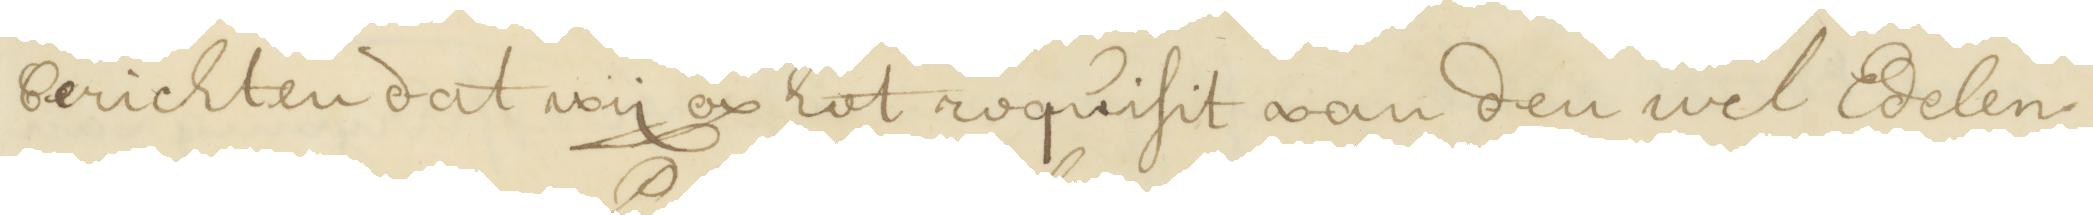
berichten dat wij op het requisit van den wel Edelen
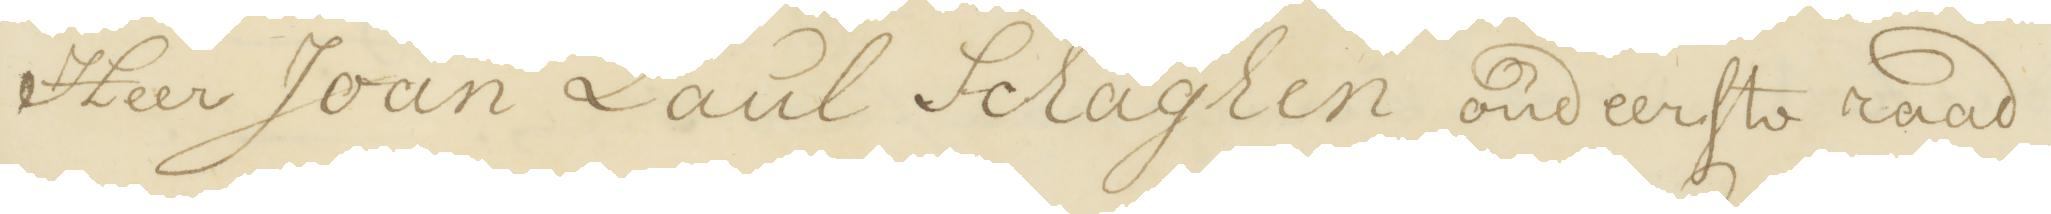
Heer Joan Paul Schaghen oud eerste raad
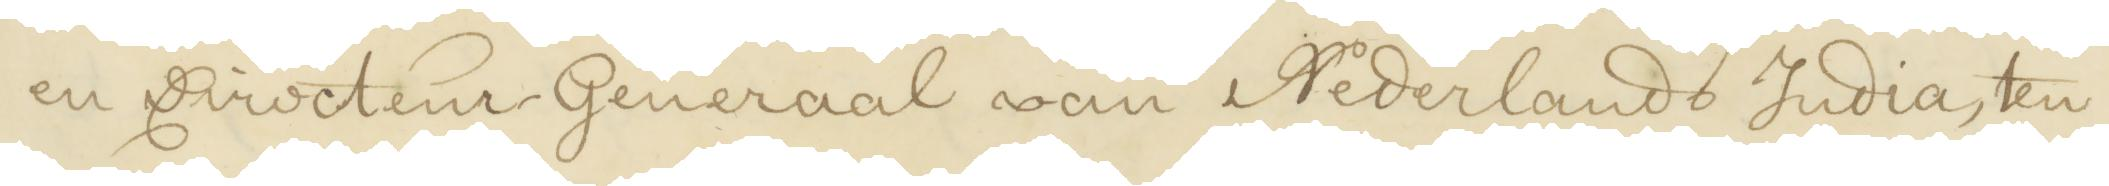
en Directeur Generaal van Nederlands India, ten
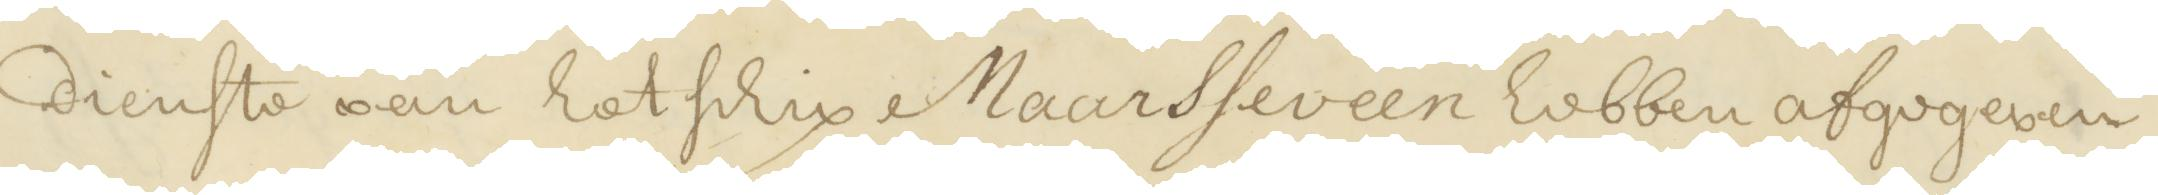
dienste van het schip Maarsseveen hebben afgegeven
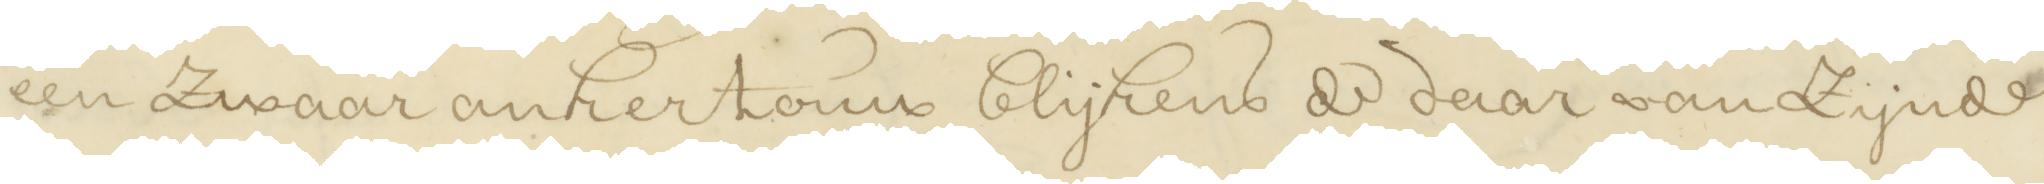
een zwaar ankertouw blijkens de daar van zijnde
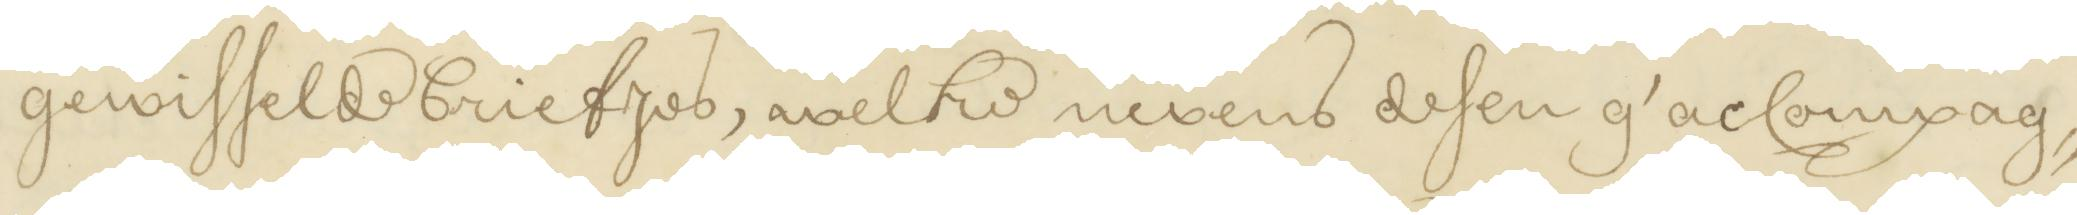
gewisselde briefjes, welke nevens desen g’accompag
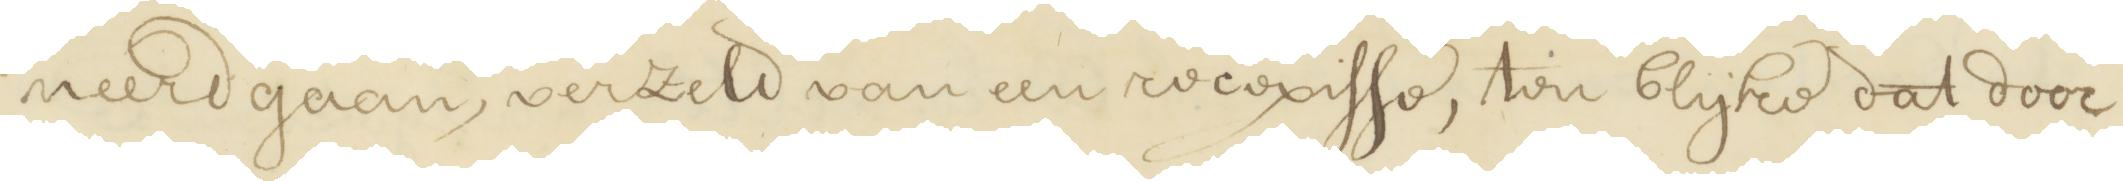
neerd gaan, verzeld van een recepisse, ten blijke dat door
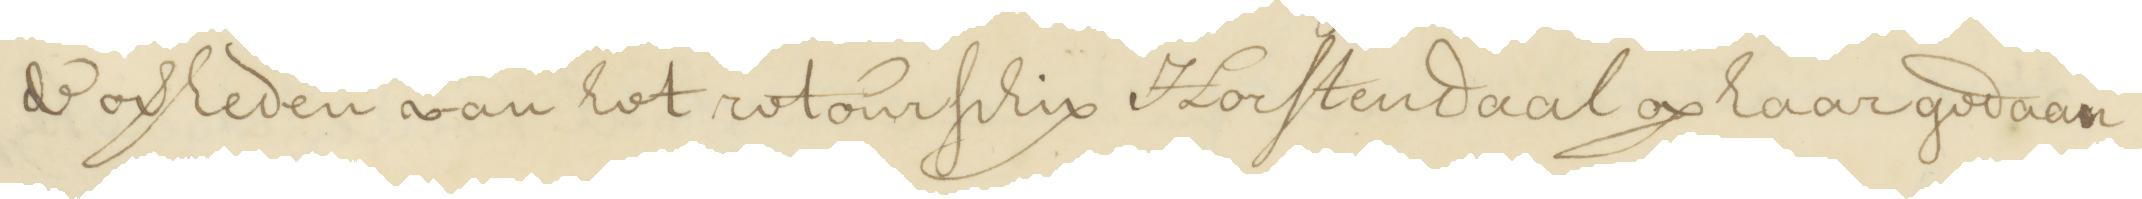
de overheden van het retourschip Horstendaal op haar gedaan
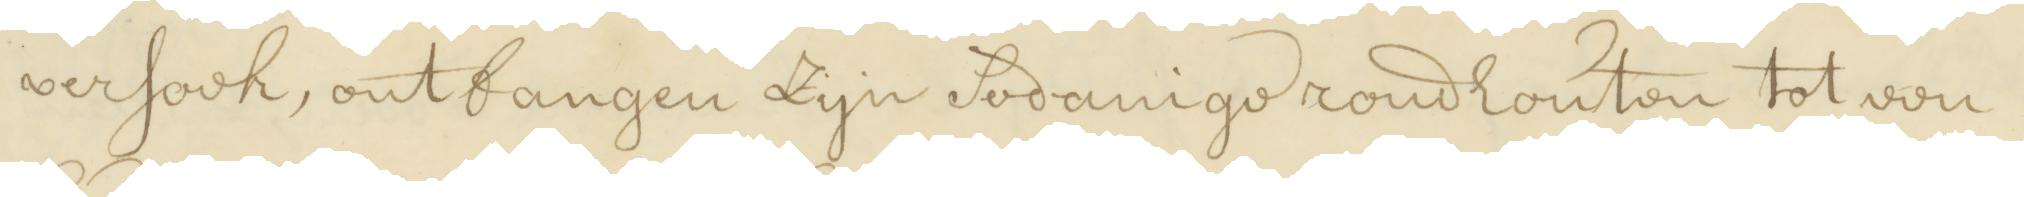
versoek, ontfangen zijn sodanige rondhouten tot een
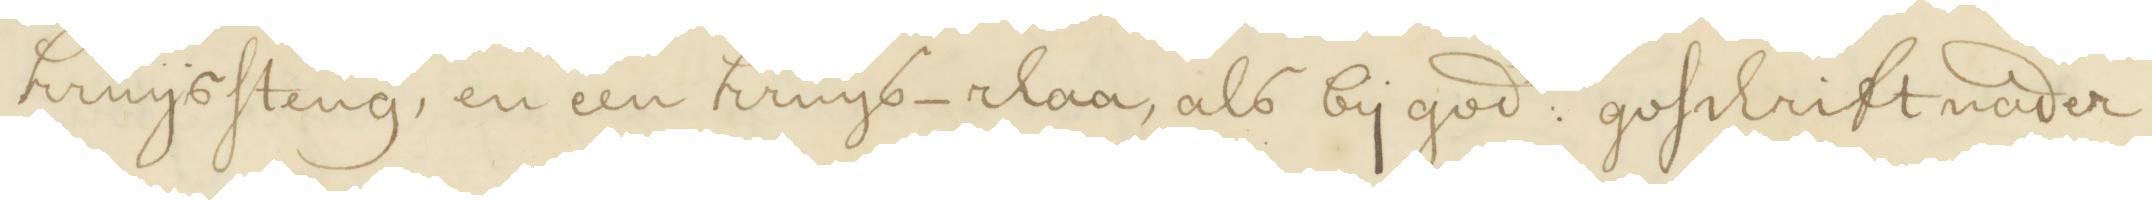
kruijssteng, en een kruijs-rhaa, als bij ged:te geschrift nader
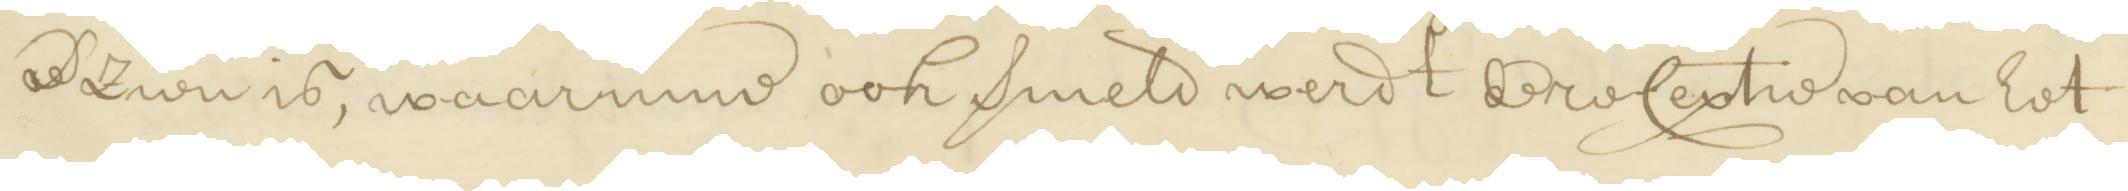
te zien is, waarinne ook vermeld werdt dereceptie van het
